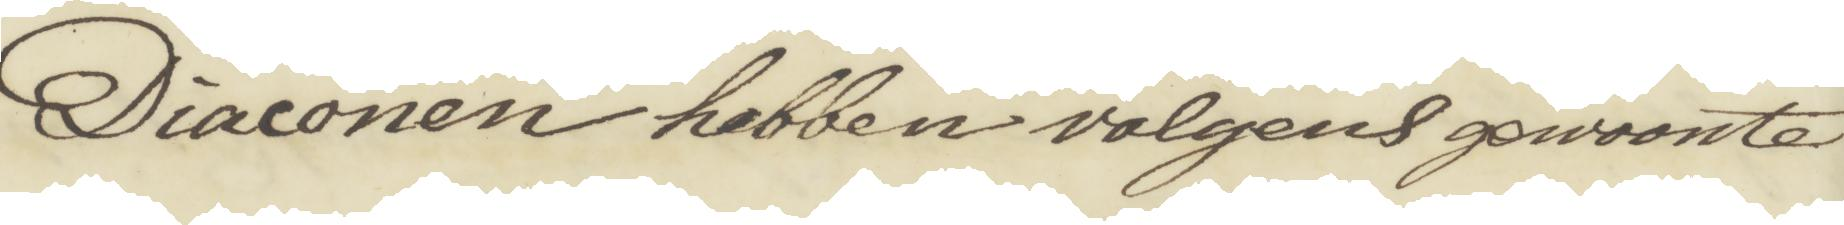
Diaconen hebben volgens gewoonte
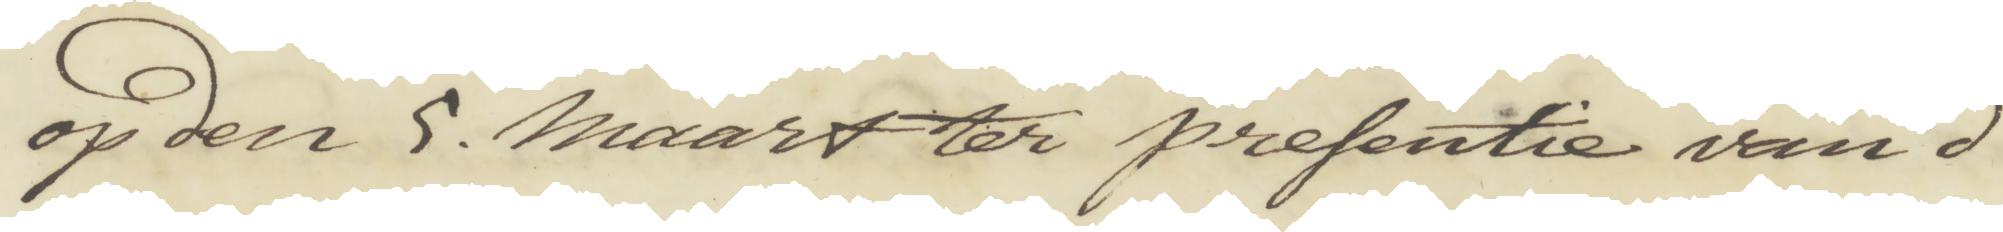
op den 5. maart ter presentie van d'
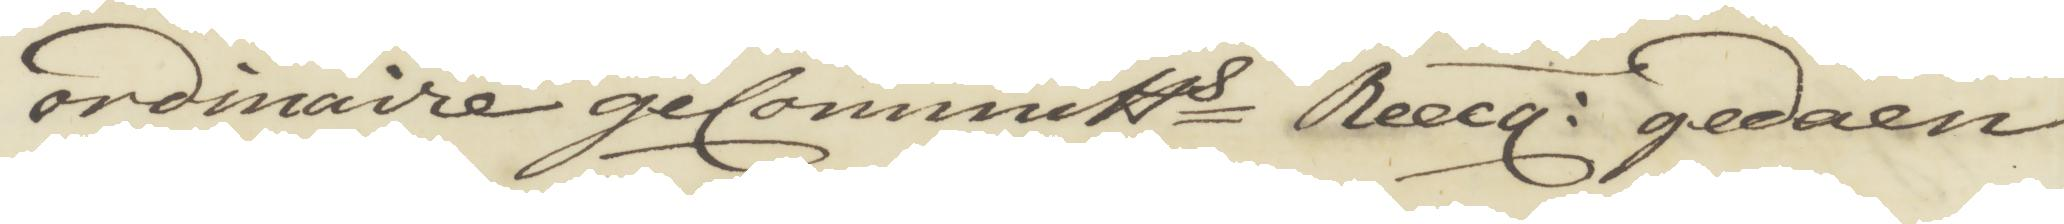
ordinaire gecommitt=s Reecq: gedaen
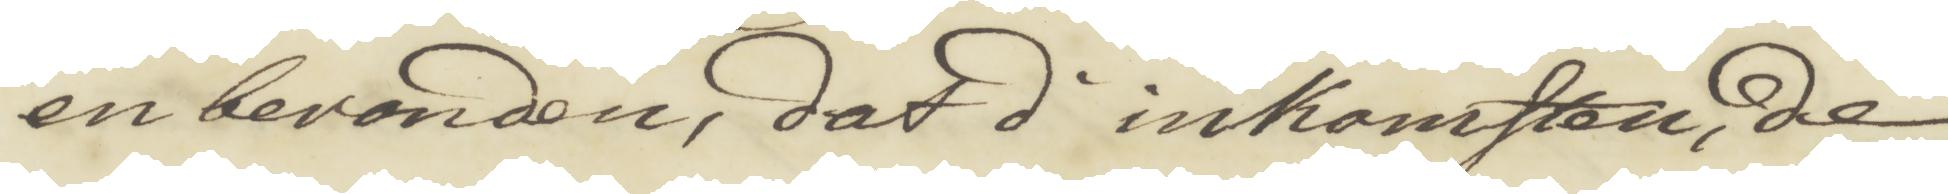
en bevonden, dat d’ inkomsten, de
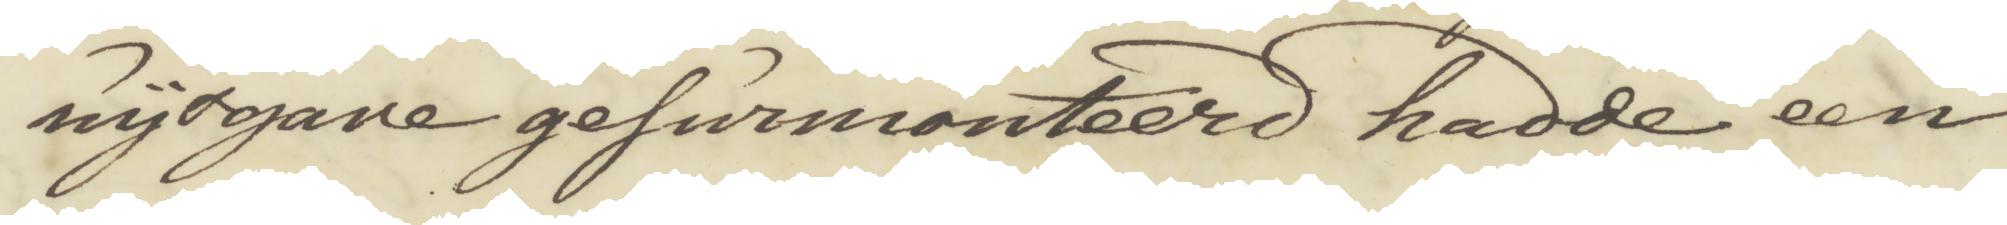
uijtgave gesurmonteerd hadde een
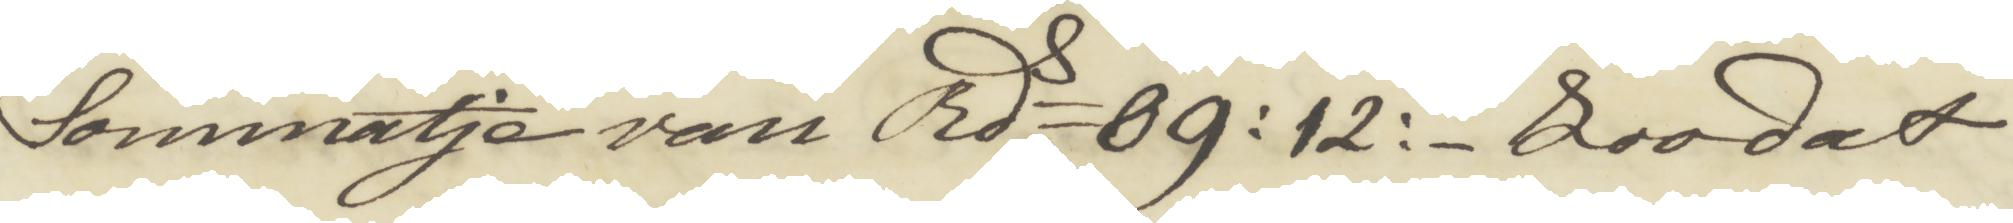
Sommatje van Rd=s 89: 12: — Zoo dat
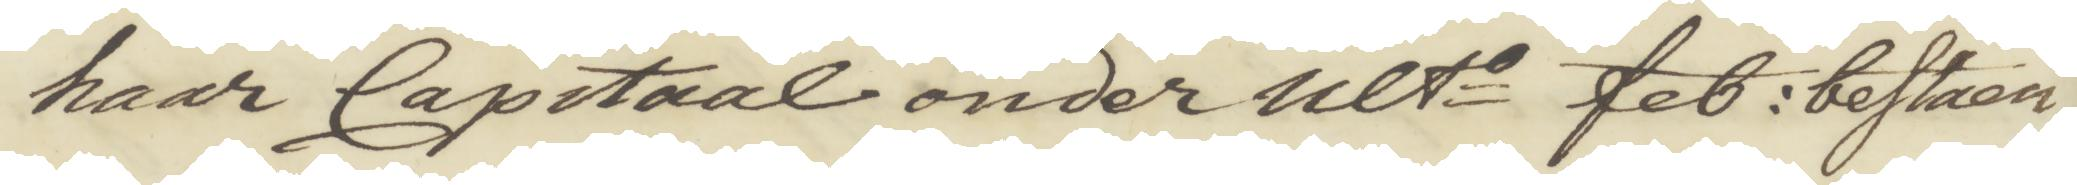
haar Capitaal onder ult=o feb: bestaen
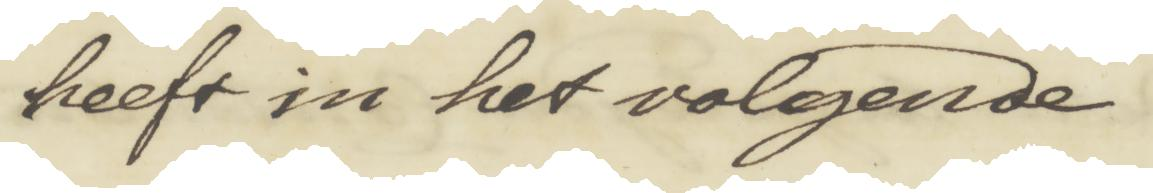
heeft in het volgende —
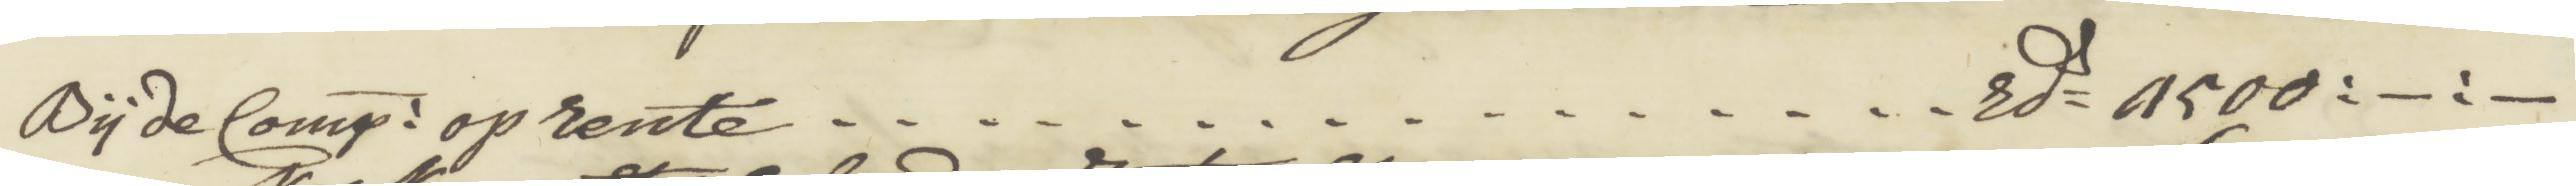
Bij de Comp: op rente . . . . . . . . . . . . . . . . . rd=s 4500: —: —
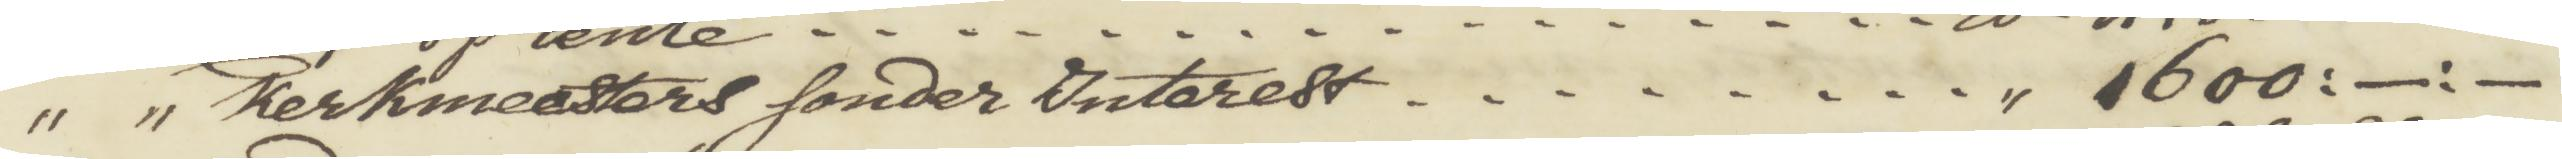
„ „ kerkmeesters sonder Interest . . . . . . . . . „ 1600: —: —
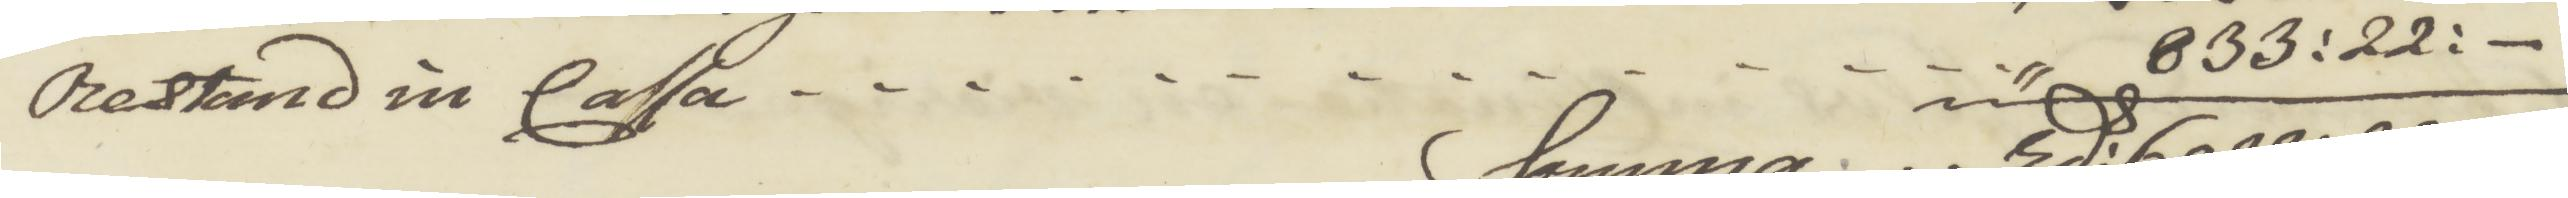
Restand in Cassa . . . . . . . . . . . . . . „ 833: 22: —
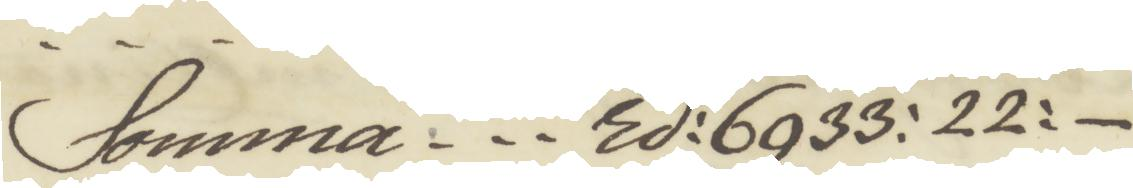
Somma . . . „ rd:s 6933: 22: —
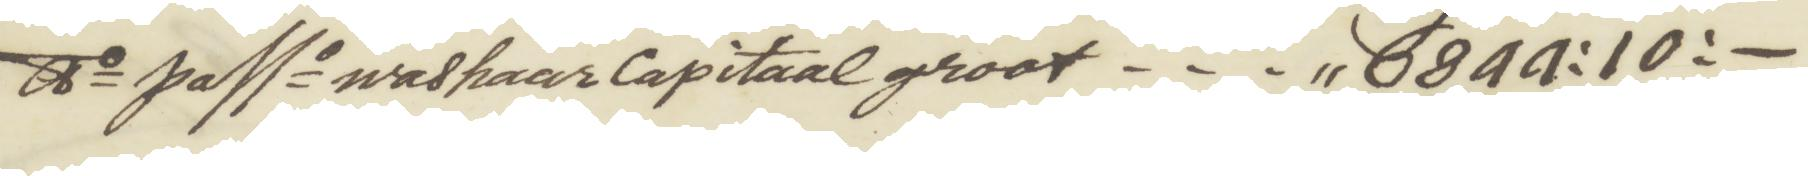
A=o pass=o was haar Capitaal groot „ 6844: 10: —
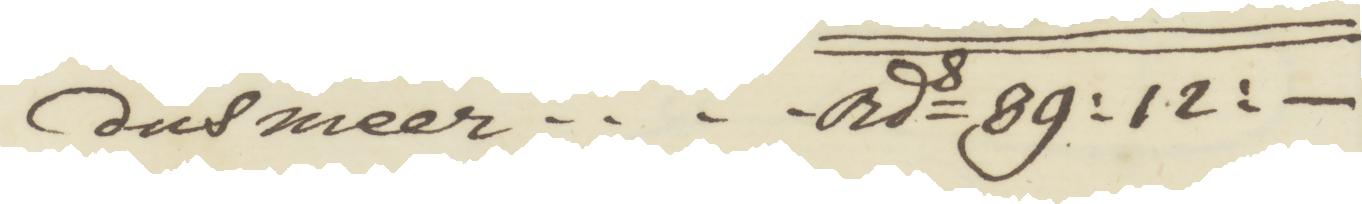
dus meer . . . . rd=s 89: 12: —
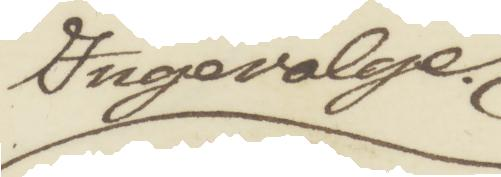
Ingevolge.
